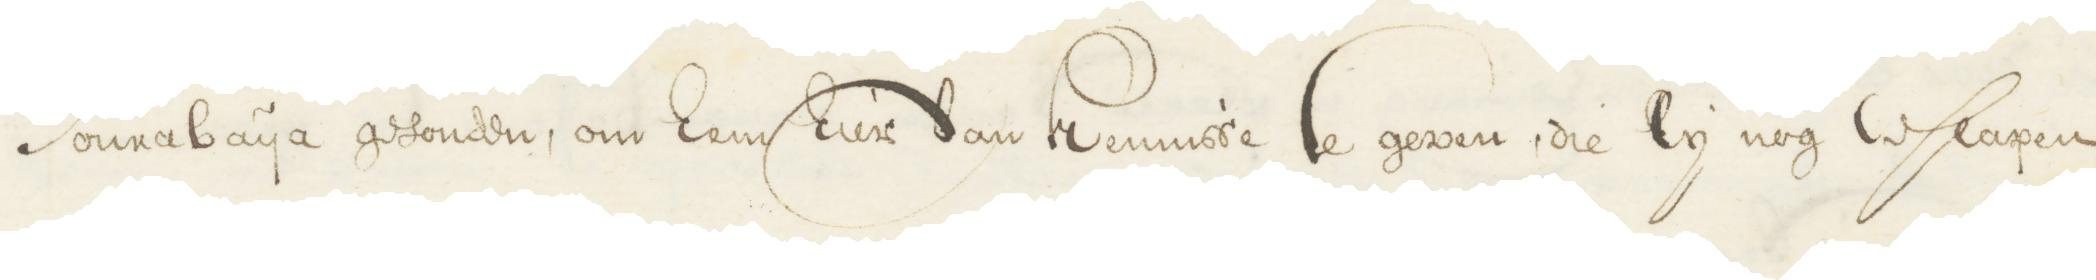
Sourabaija gesonden, om hem hier van kennisse te geven, die lij nog te Slapen
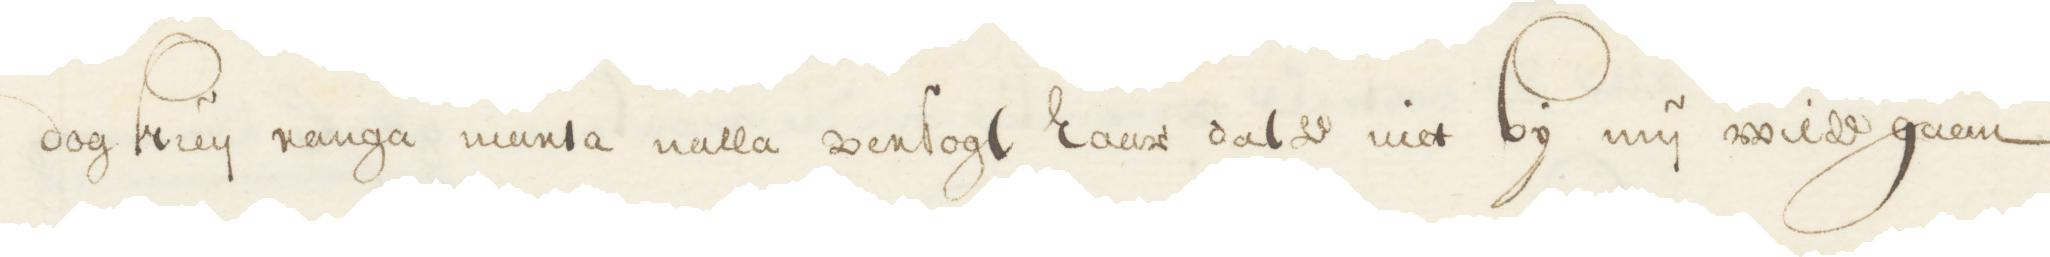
dog kieij ranga marta nalla versogt haar dat se niet bij mij wilde gaan
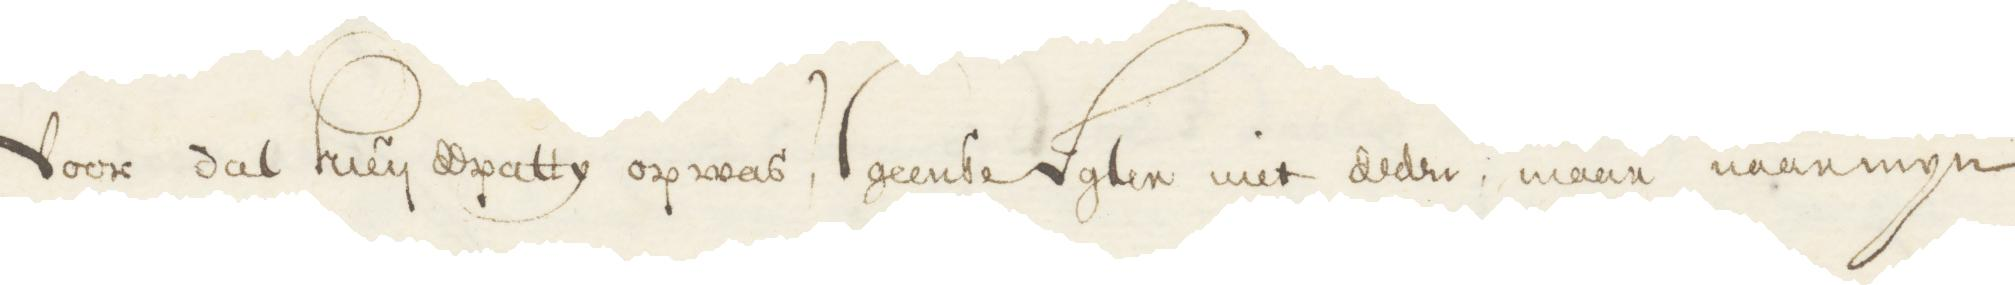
Voor dat kieij depatty op was, 't geen se Egter niet deden; maar naar myn
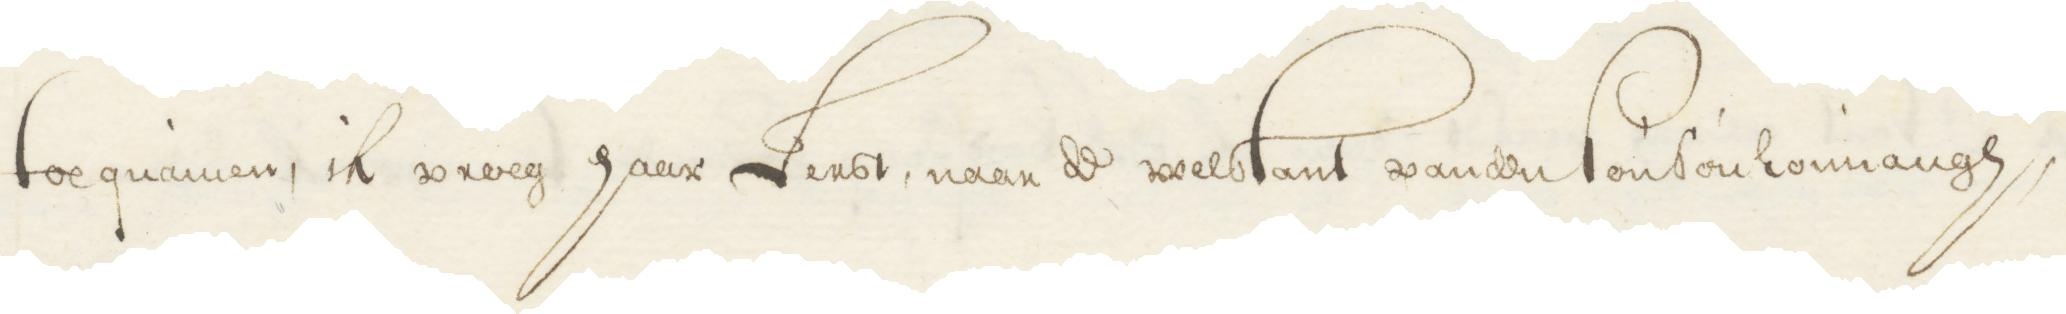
toe quamen, ik vroeg haar Eerst, naar de welstant van den Sousouhounangh,
